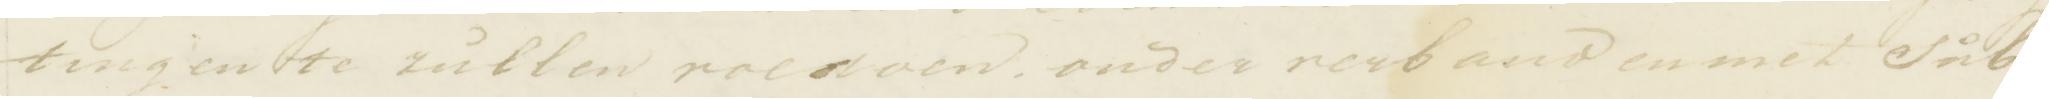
tingen te zullen voldoen, onder verband en met sub
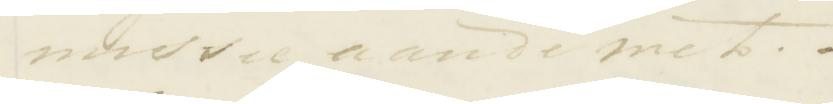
missie aande wet.
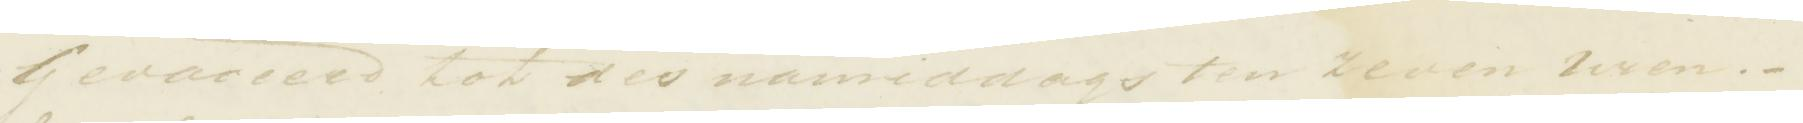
Gevaceerd tot des namiddags ten zeven uren. -
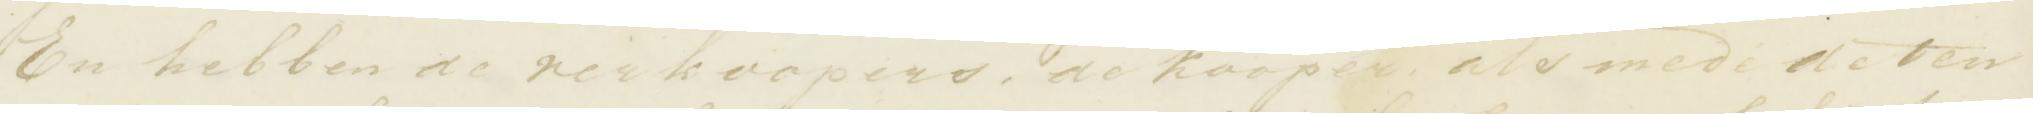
En hebben de verkoopers, de kooper als mede de ten
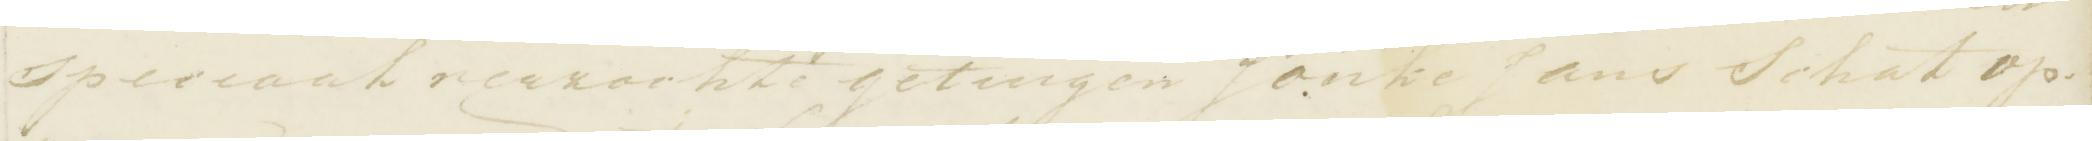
speciaal verkochte getuigen Jouke Jans Schat op„
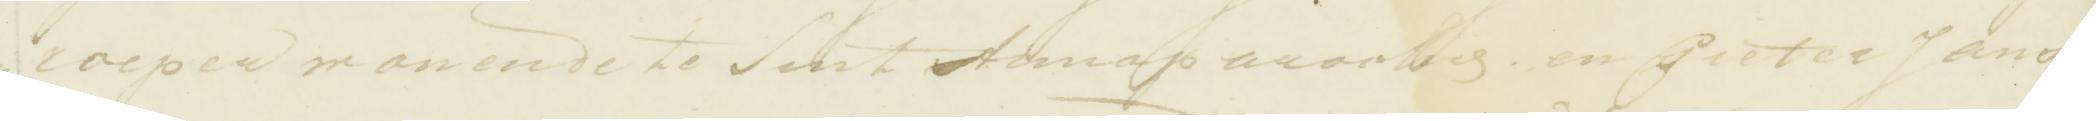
roeper wonende te sint Annaparochie en Pieter Jans
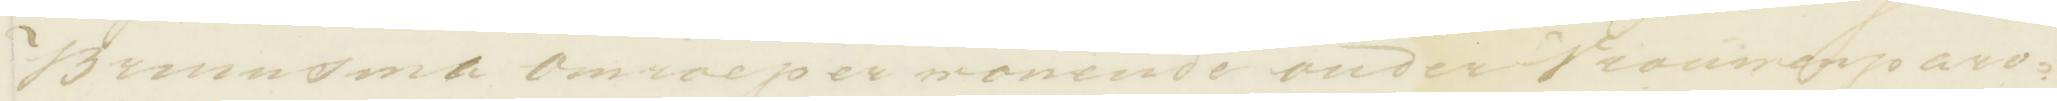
Bruinsma omroeper wonende onder Vrouwenparo
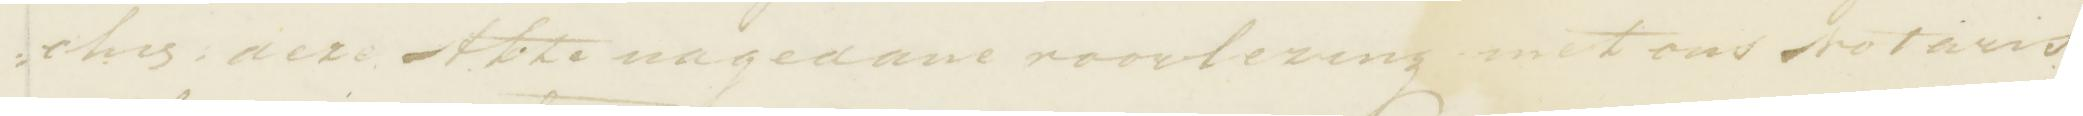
„chie, deze Akte nagedane voorlezing met ons Notaris
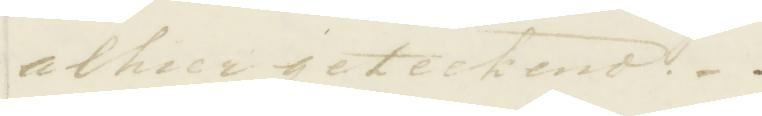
alhier geteekend. -
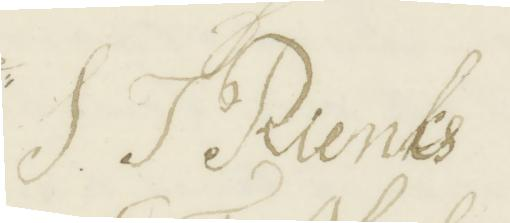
S. T Rienks
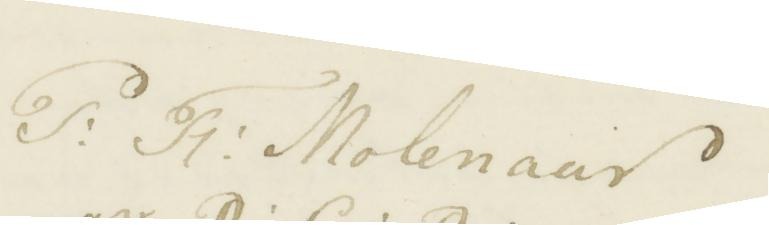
P: F: Molenaar
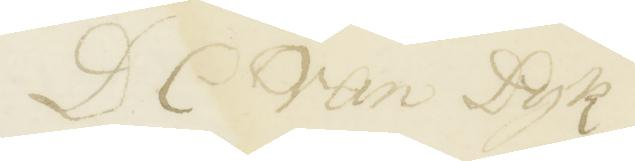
D C Van Dyk
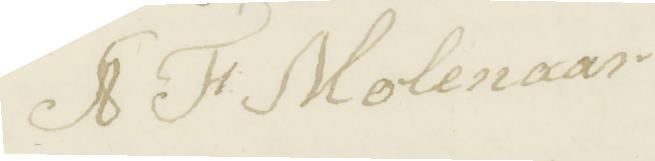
A F: Molenaar
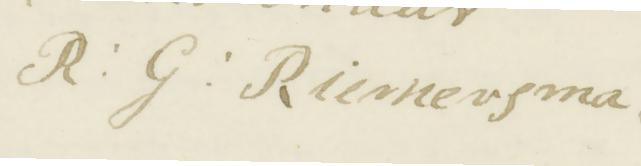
R: G: Riemersma
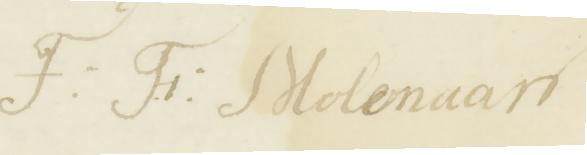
F: F: Molenaars
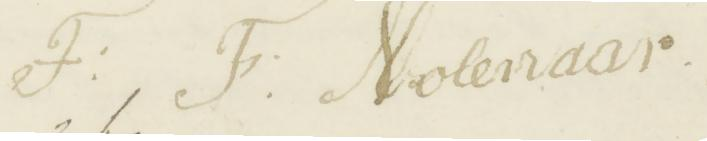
F: F: Molenaar.
